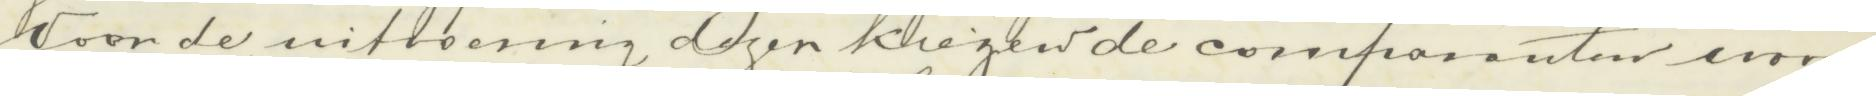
Voor de uitvoering dezer kiezen de comparanten woon
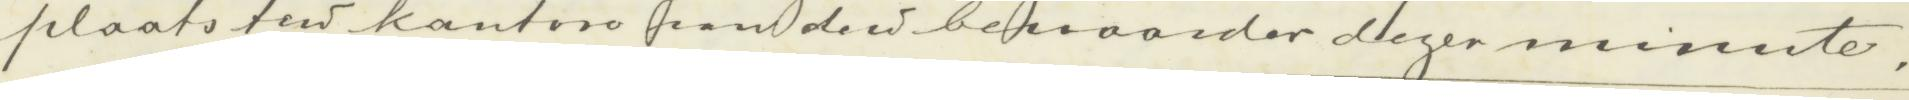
plaats ten kantore van den bewaarder dezer minute,
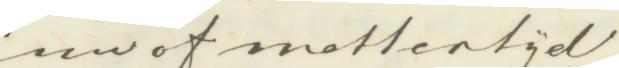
nu of mettertijd
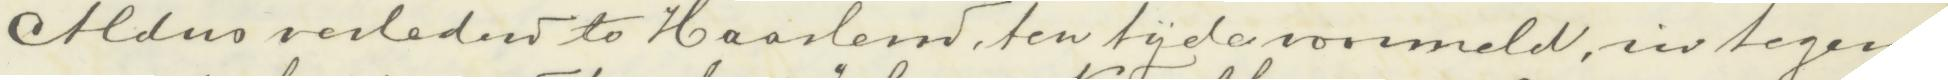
Aldus verleden te Haarlem, ten tijde voormeld, in tegen
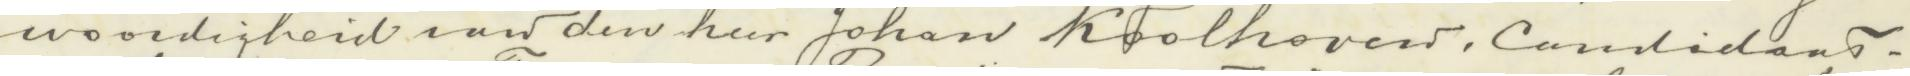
woordigheid van den heer Johan Koolhoven, Candidaat-
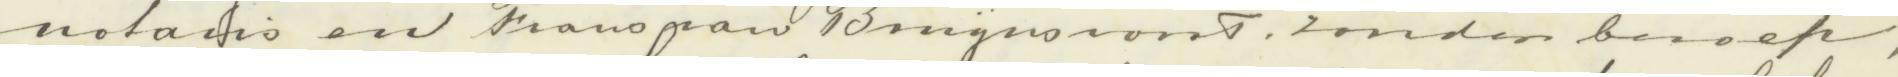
notaris en Frans van Bruijnsvoort, zonder beroep,
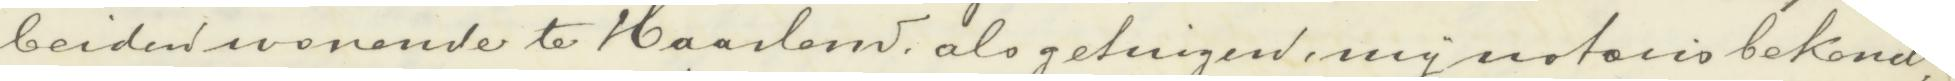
beiden wonende te Haarlem, als getuigen, mij notaris bekend,
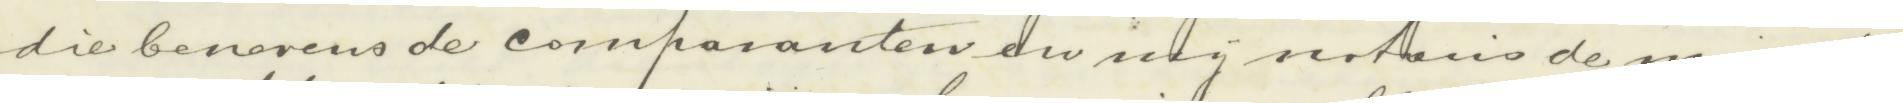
die benevens de comparanten en mij notaris de minute
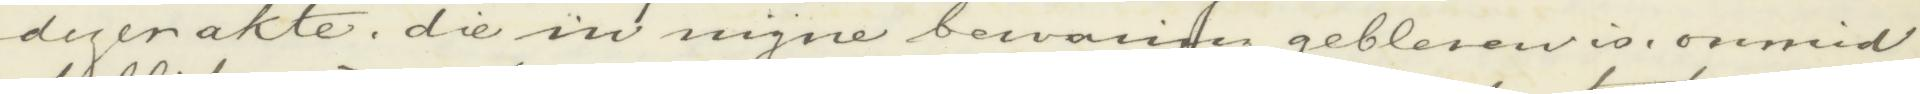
dezer akte, die in mijne bewaring gebleven is, onmid,
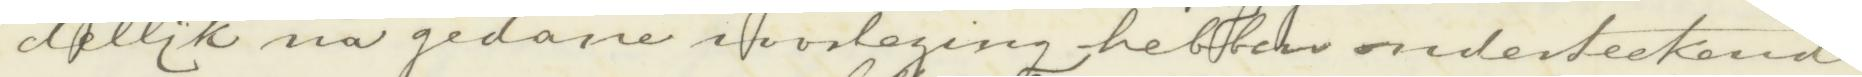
delljk na gedane voorlezing hebben onderteekend
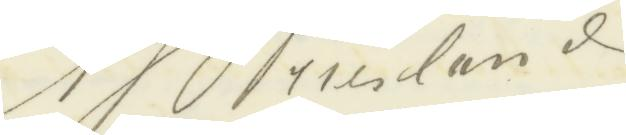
AJ Vriesland
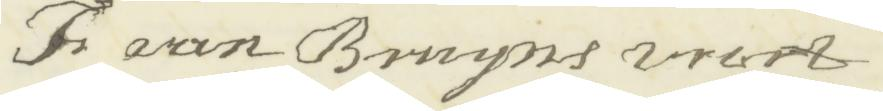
F van Bruynsvoort
